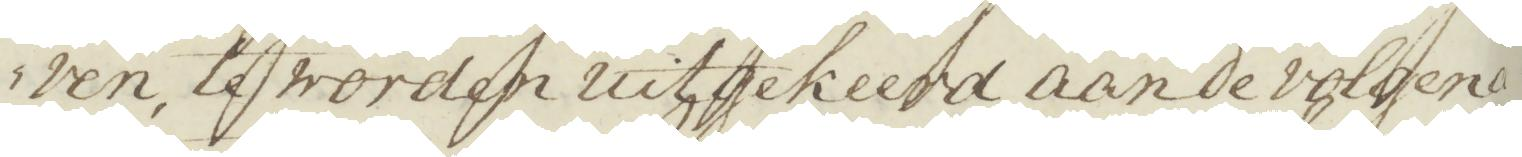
„ven, te worden uitgekeerd, aan de volgen
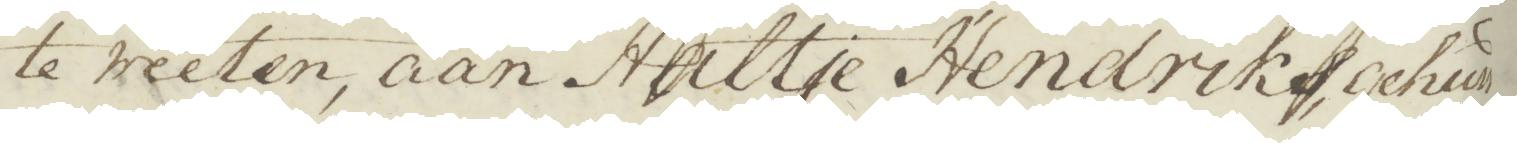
te weeten, aan Aaltje Hendriks, gehuw
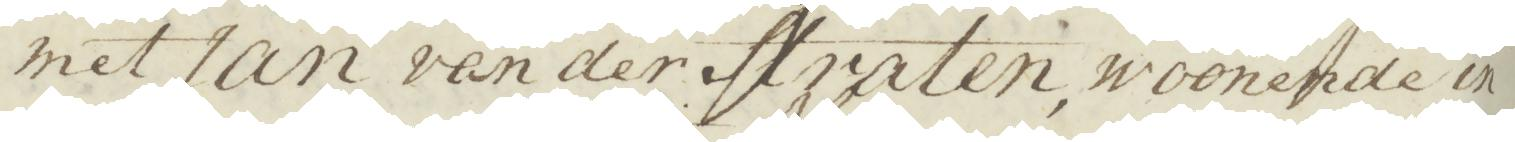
met Jan van der Straten, woonende in
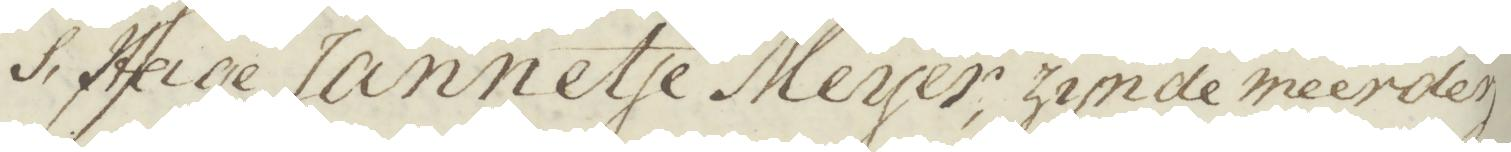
S, Hage, Jannetje Meyer, zynde meerder
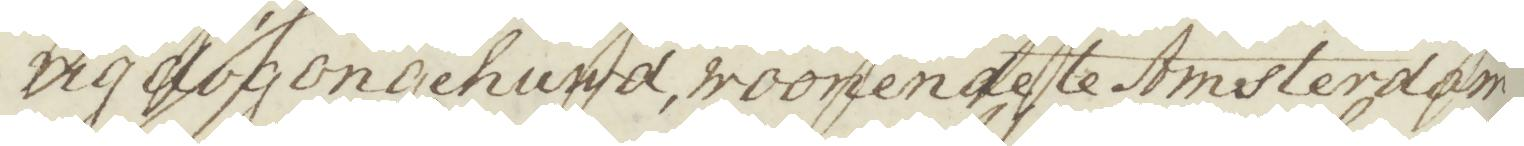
rig dog ongehuwd, woonende te Amsterdam
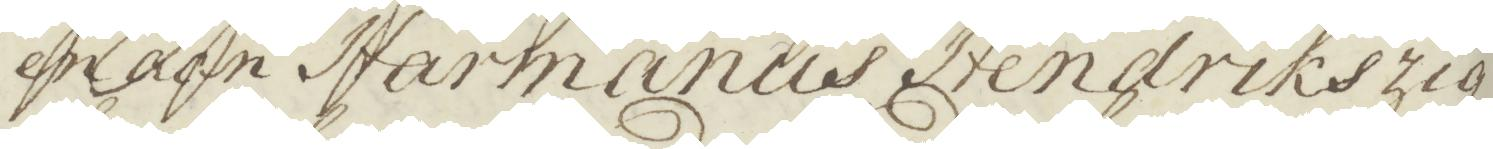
en aan Harmanus Hendriks zig
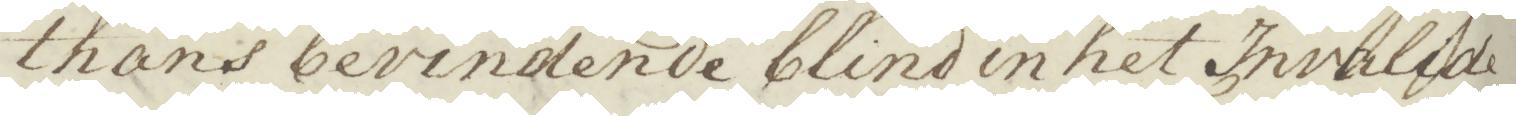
thans bevindende blind in het Invalide
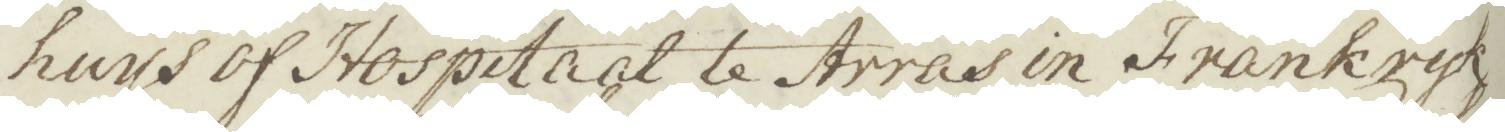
huys of Hospitaal te Arras in Frankryk
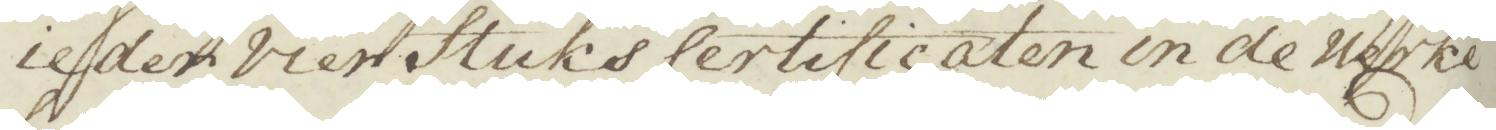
ieder vier stuks Certificaten in de Werke
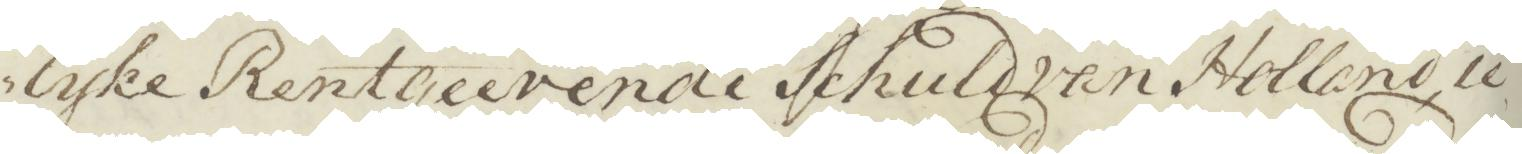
„lyke Rentgeevende Schuld van Holland, ie
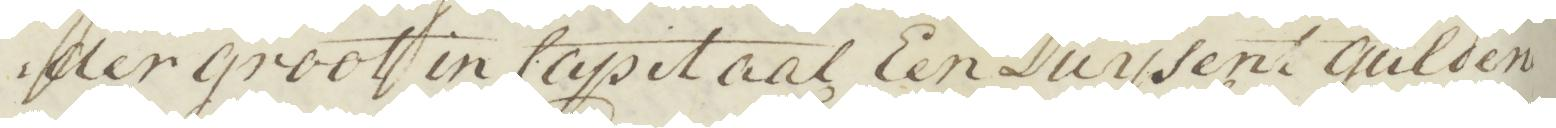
„der groot in Capitaal Een Duysent gulden
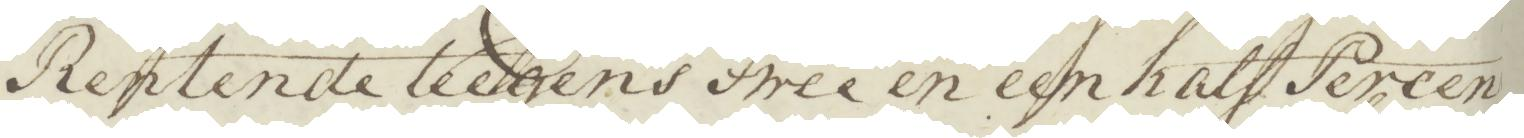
Rentende teegens Twee en een half Percen
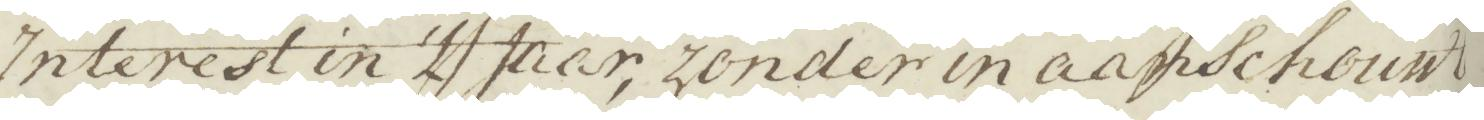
Jnterest in 't Jaar, zonder in aanschouw
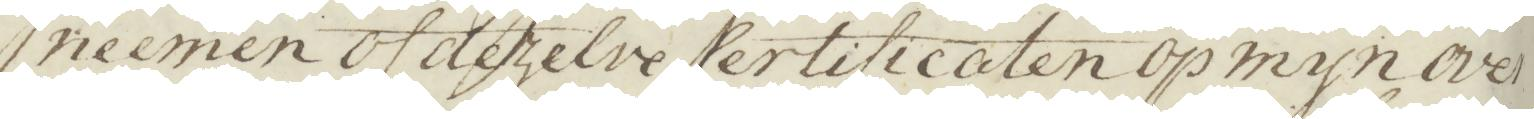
neemen of dezelve Certifcaten op myn ove
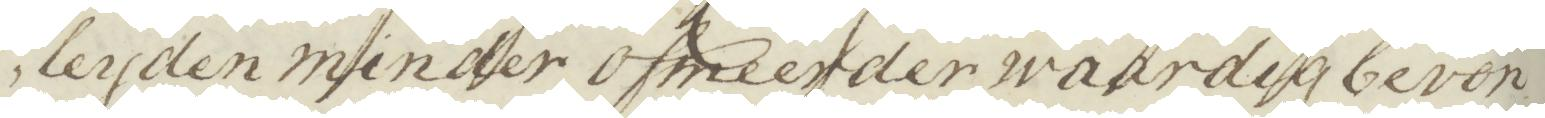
„leyden minder of meerder waardig bevon
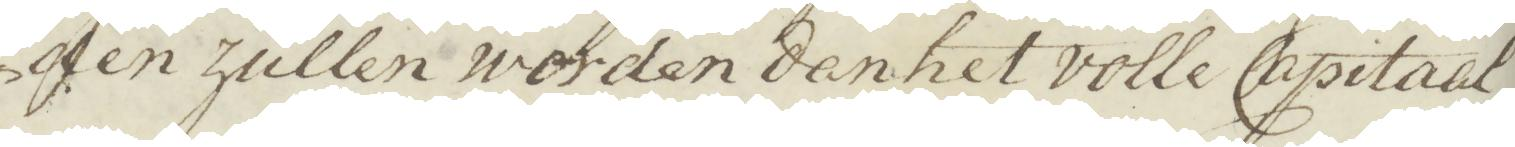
den zullen worden dan het volle Capitaal
